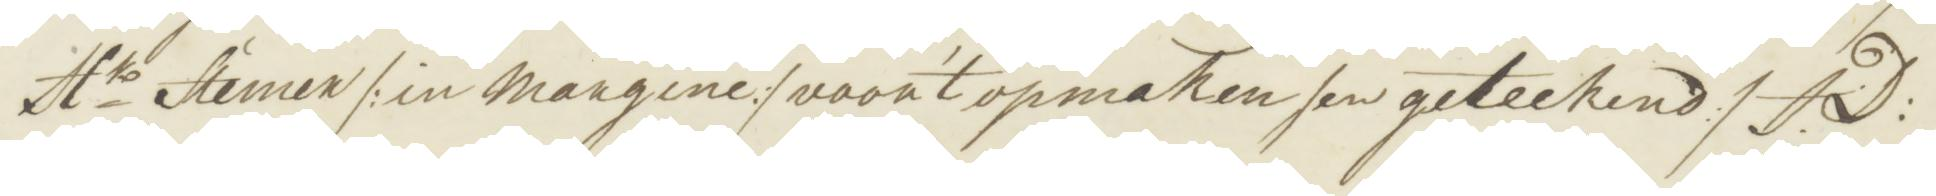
H=k Stemer /:in margine:/ voor't opmaken sen geteekend:/ f: D:
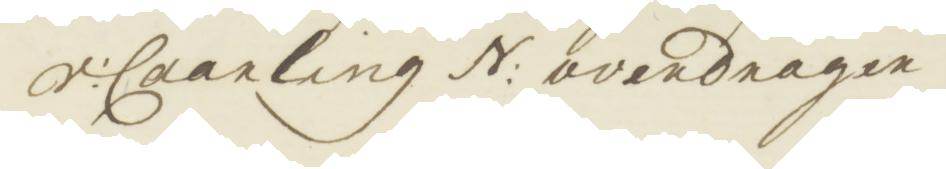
v: Caarling N: overdrager
